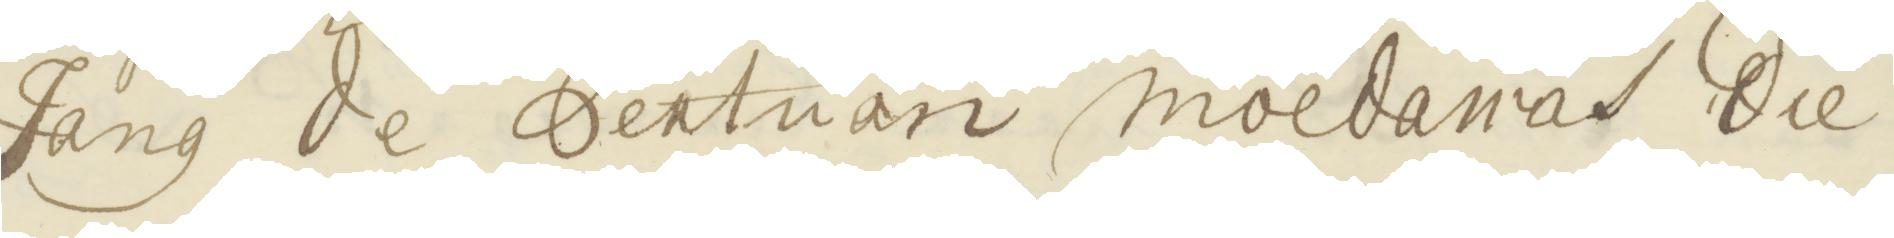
Jang de Pertuan moeda was die
